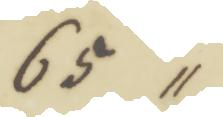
65 „
